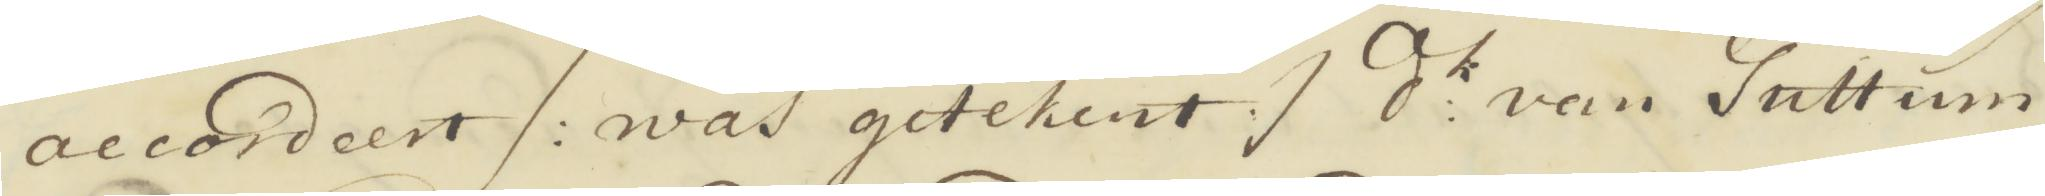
accordeert /: was getekent :/ d:k van Suttum
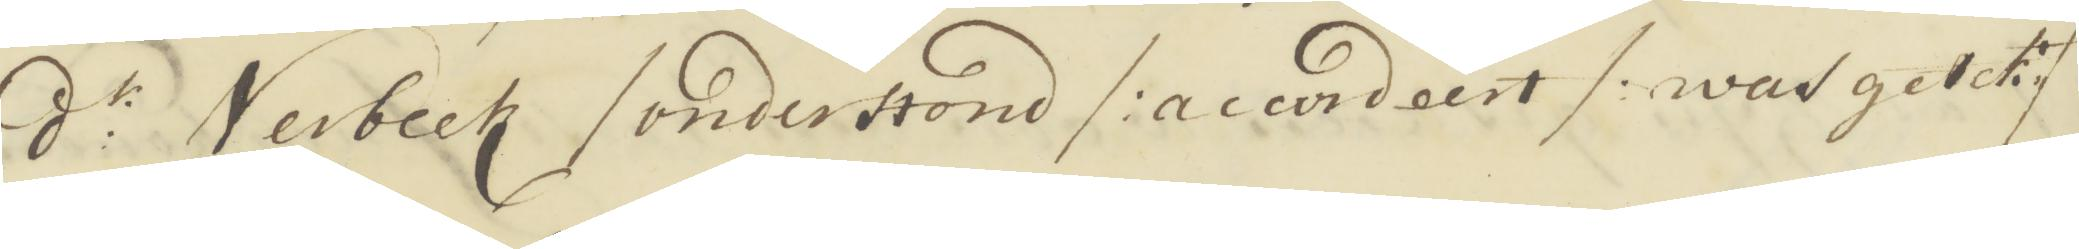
d:k Verbeek / onderstond /: accordeert /: was getek„t/
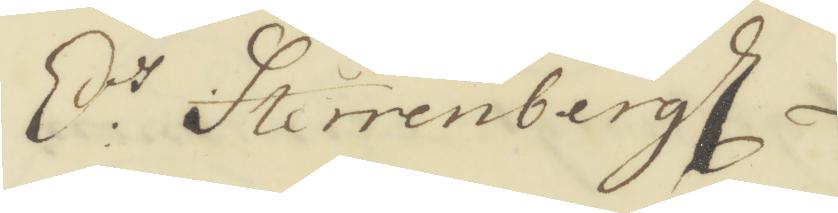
E:s Sterrenberg
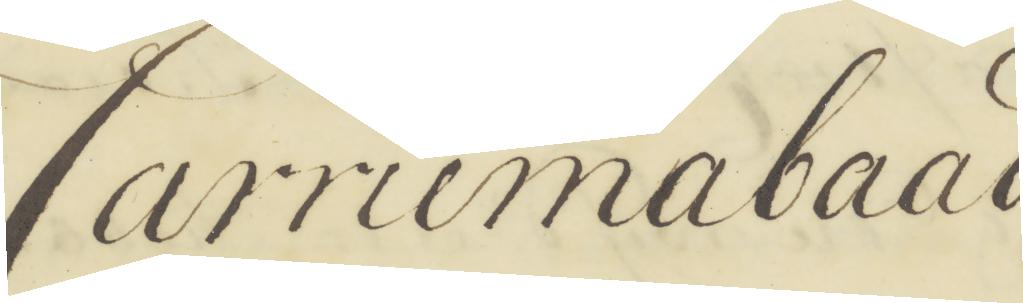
Carriemabaadh
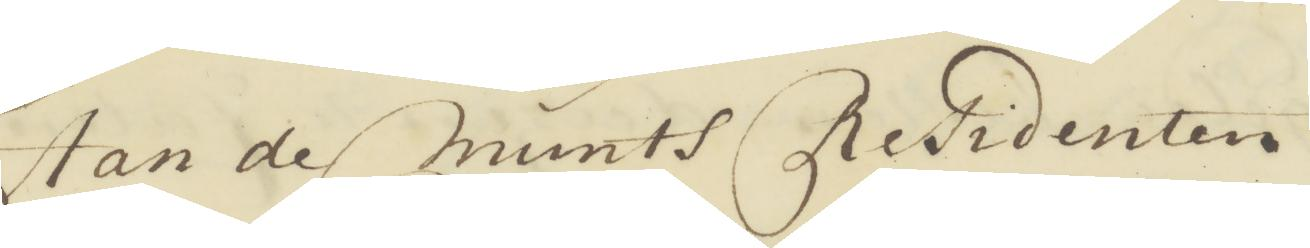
Aan de munts Residenten
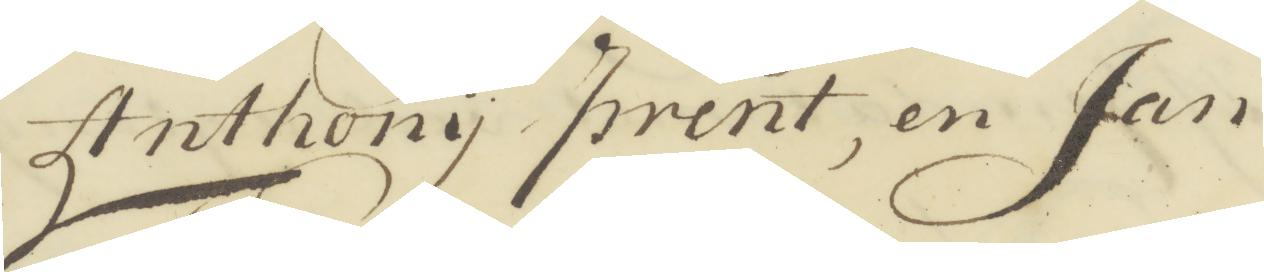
Anthonij Prent, en Jan
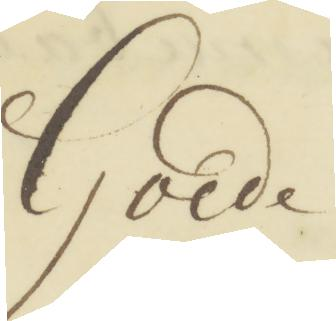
Goede
